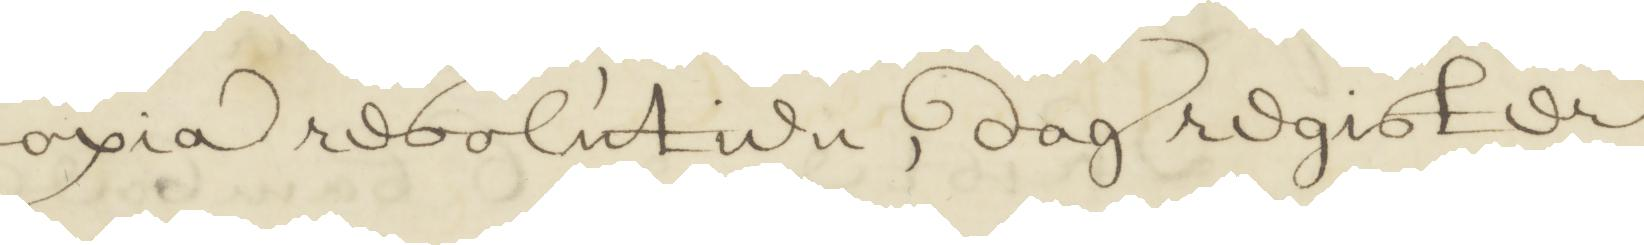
opia resolutien, dag register
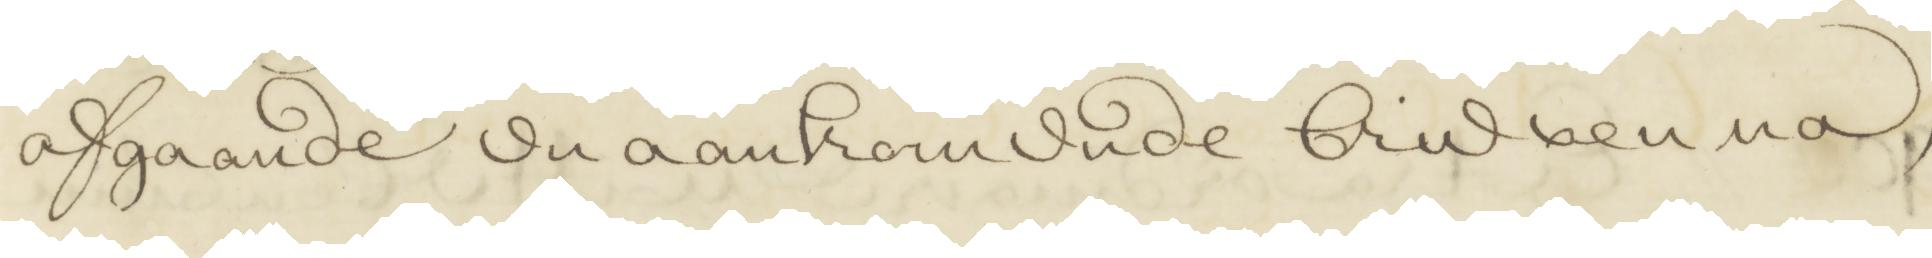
afgaande en aankomende brieven na,
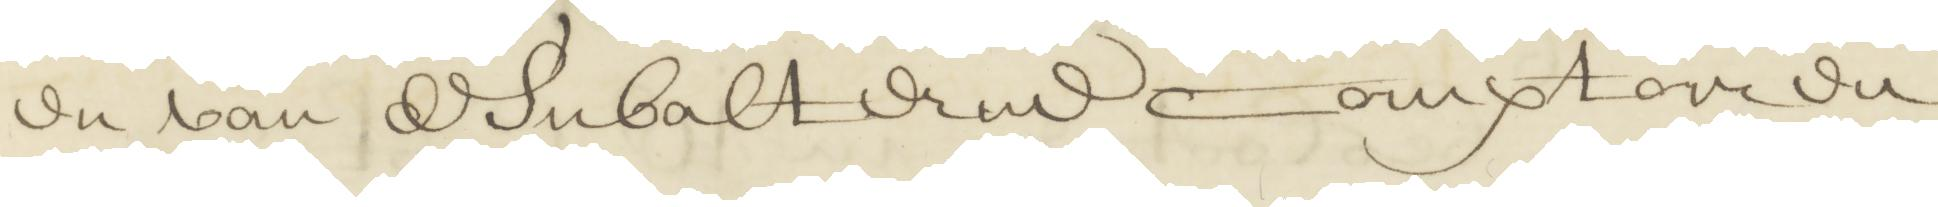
en van de subalterne comptoiren
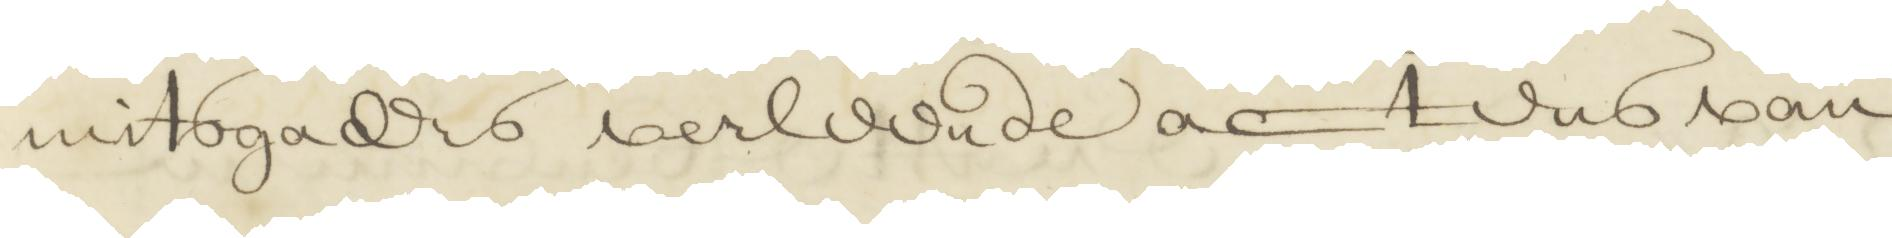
mitsgaders verleende actens van
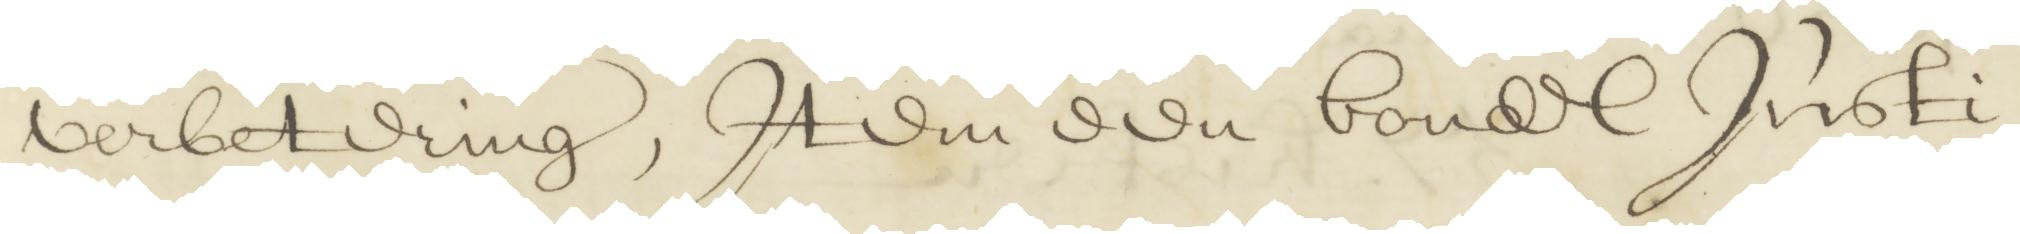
verbetering, Jtem een bondel Justi
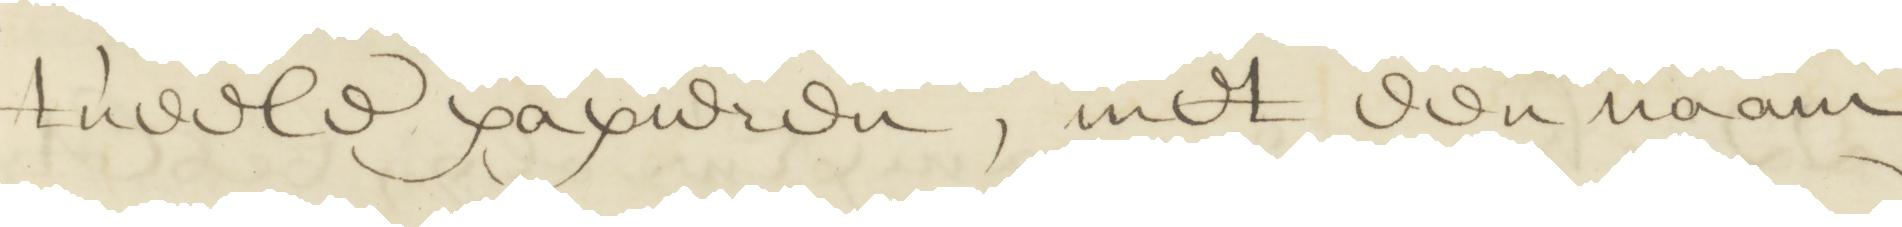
tueele papieren, met een naam
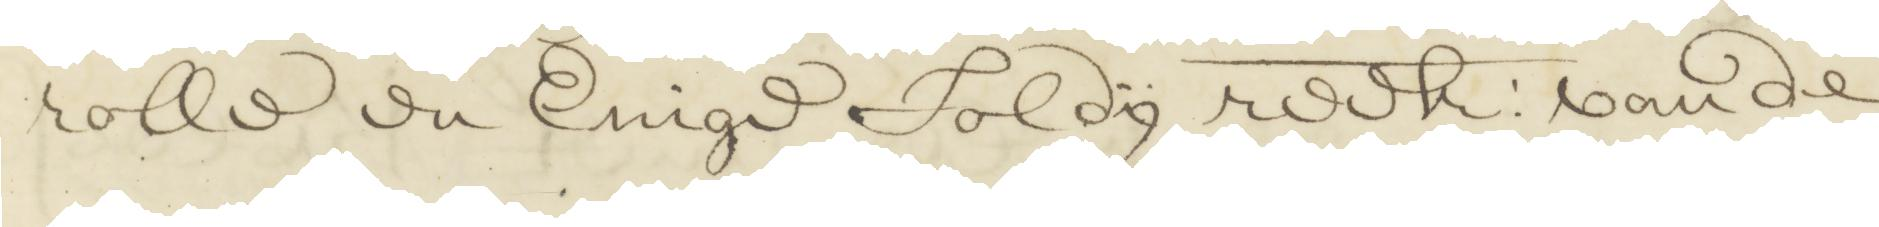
rolle en Enige soldij reek: van de
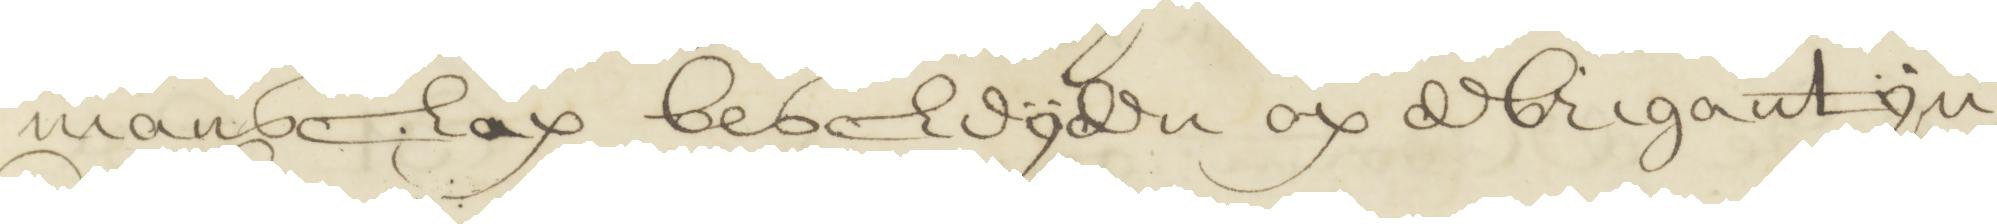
manschap bescheijden op de brigantijn
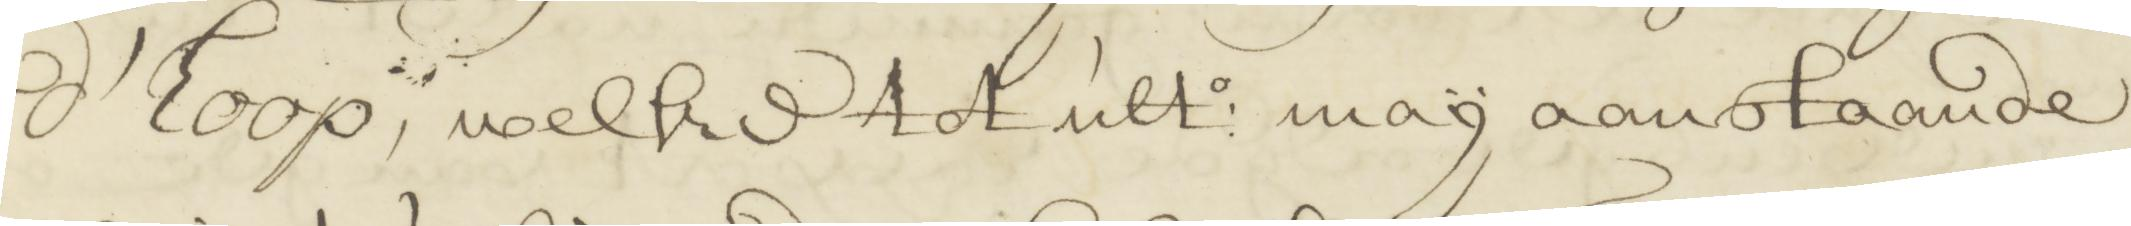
d'Hoop, welke tot ult:o maij aanstaande
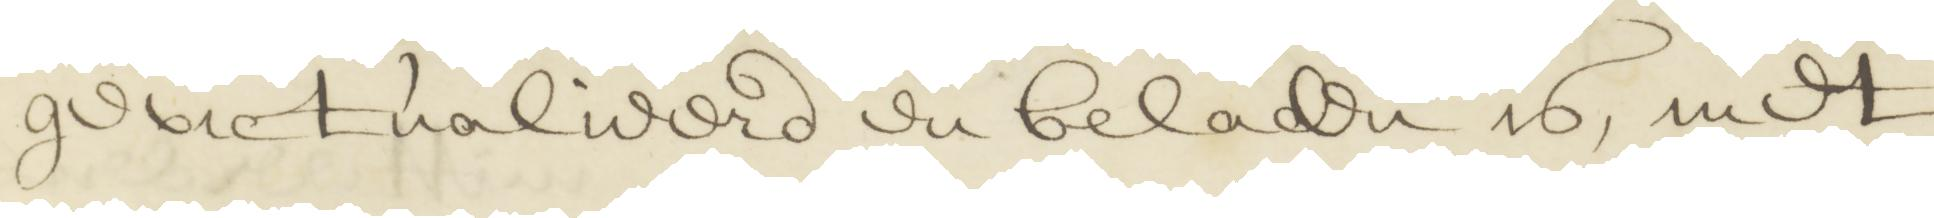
gevictualieerd en beladen is, met
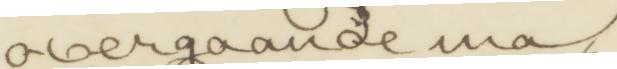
overgaande ma„
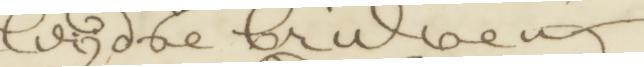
leijdse brieven
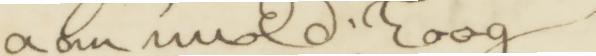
aan uw Ed: hoog
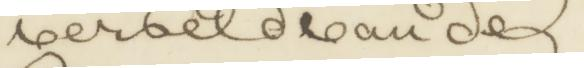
verseld van de
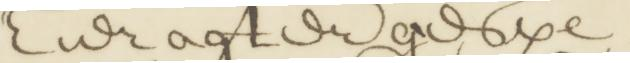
hier agter gespe
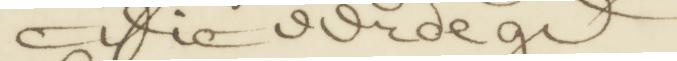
cificeerde ge
